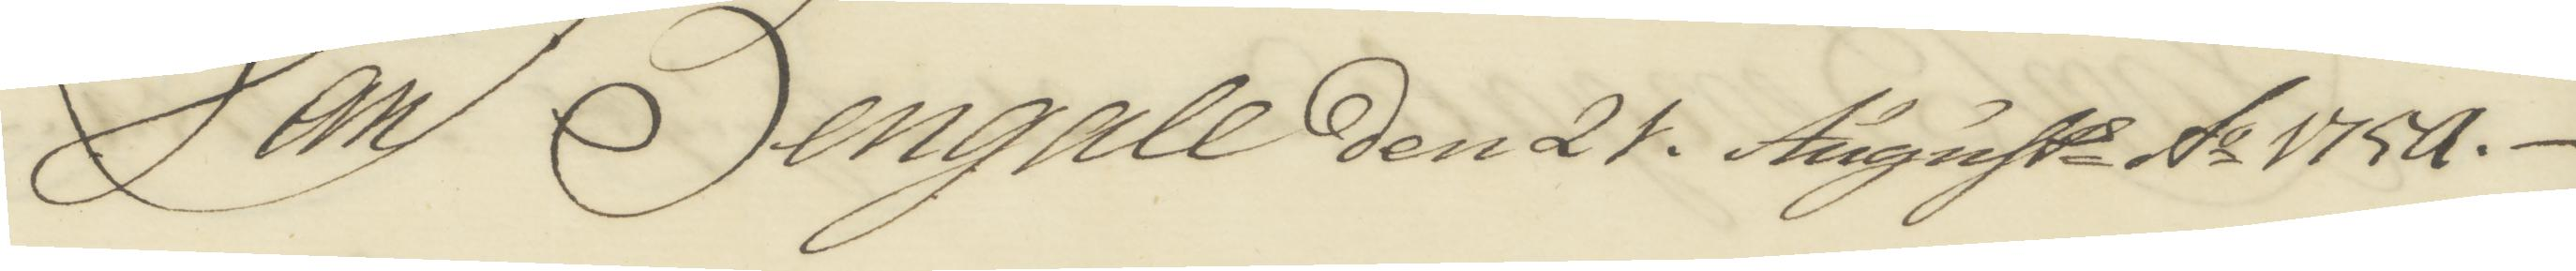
Van Bengale den 21. August=s A=o 1754.—
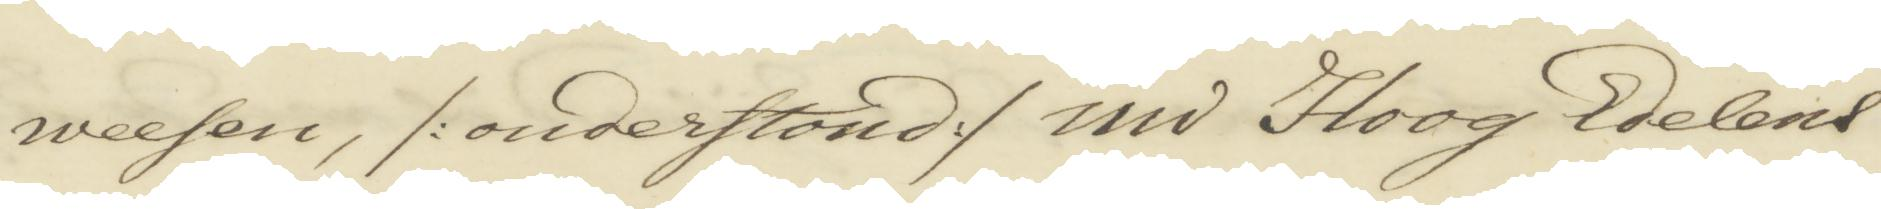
weesen, /: onderstond:/ uw Hoog Edelens
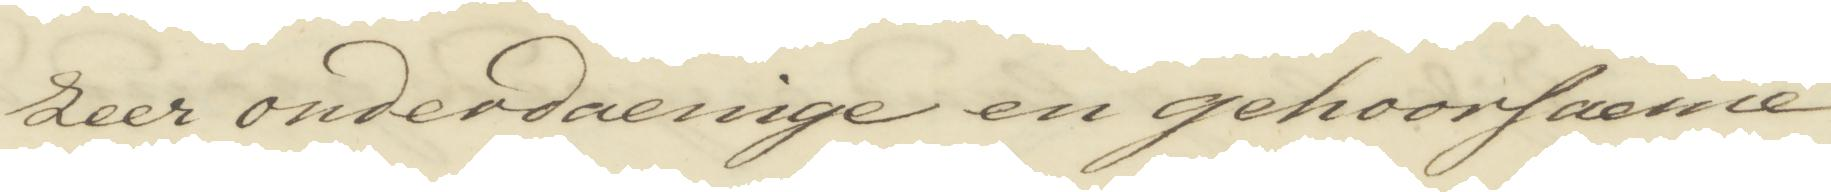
zeer onderdaenige en gehoorsaeme
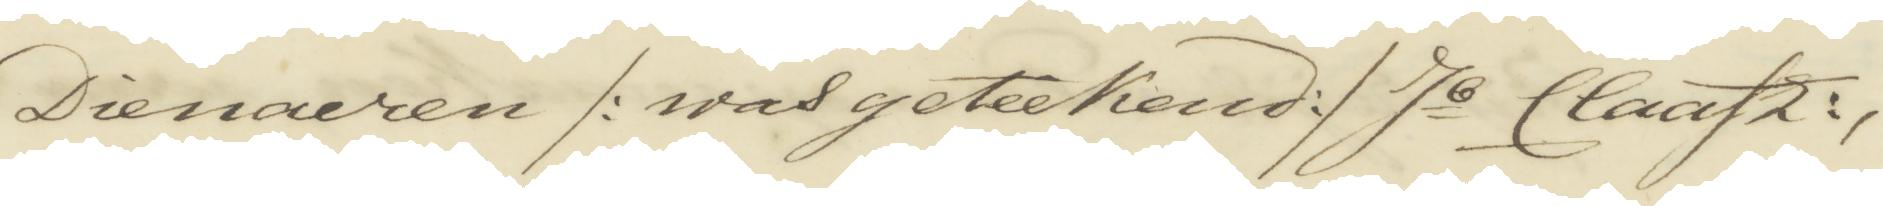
Dienaeren /: was geteekend:/ J=b Claasz :,
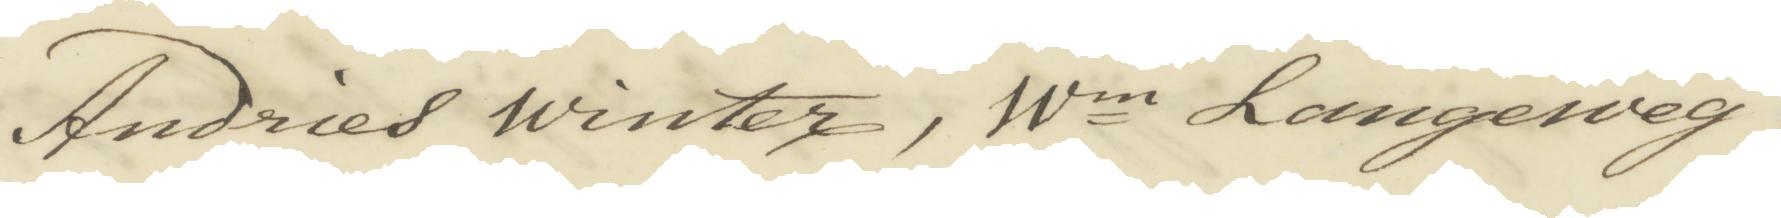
Andries winter, W=m Langeweg
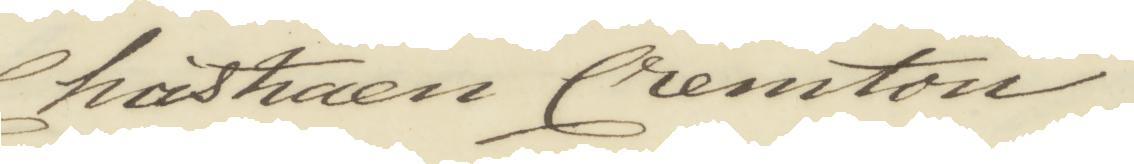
Christiaen Cremtou.
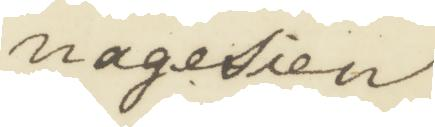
nagesien
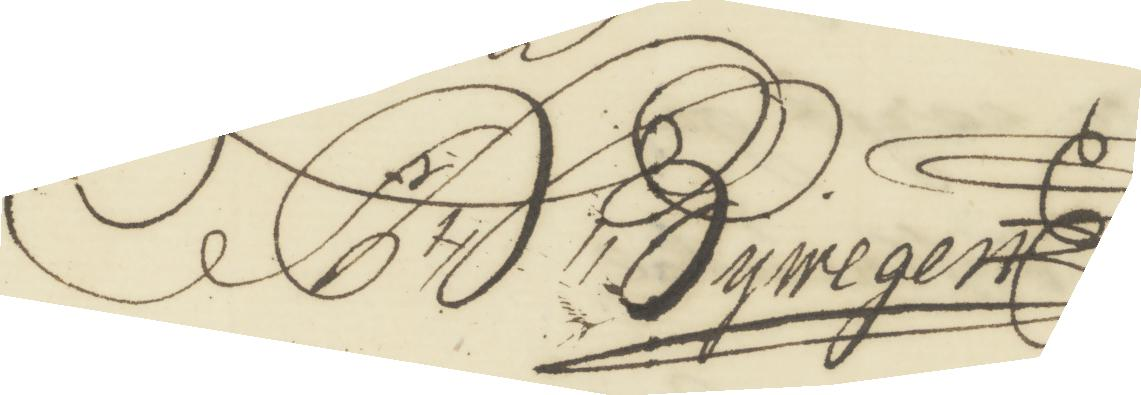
v Bijwegen
